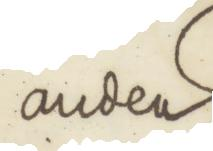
ander
